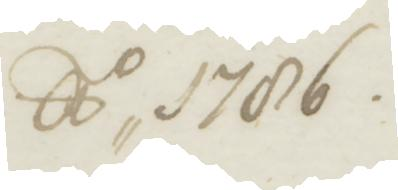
a„o 1786.
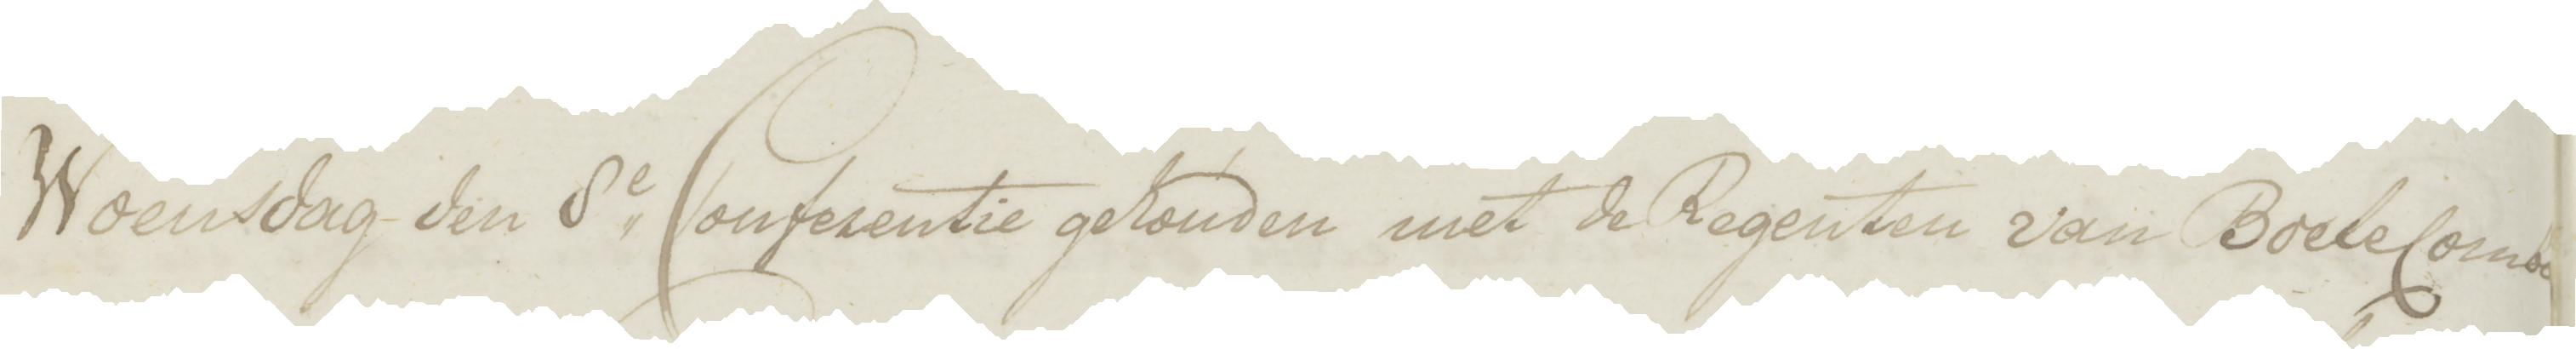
Woensdag den 8„e Conferentie gehouden met de Regenten van Boelecombo
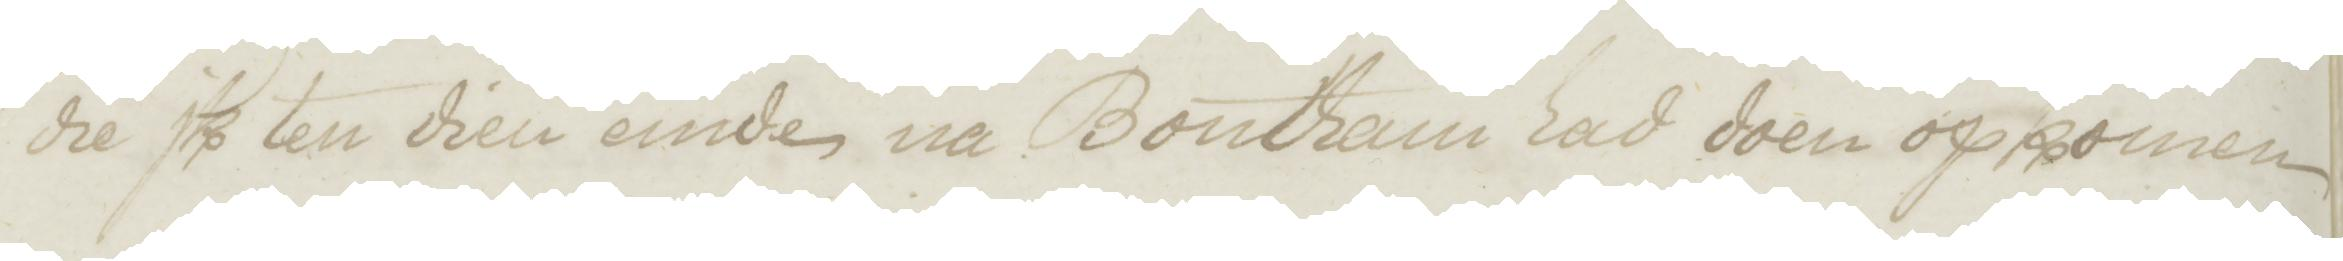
die jk ten dien einde na Bontham had doen opkomen
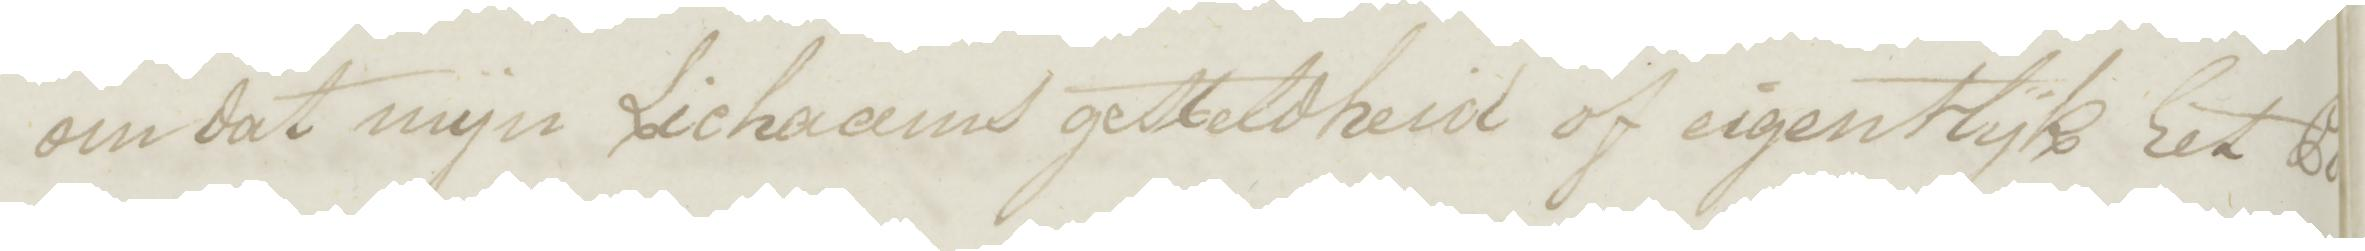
om dat mijn Lichaams gesteldheid of eigentlijk het P
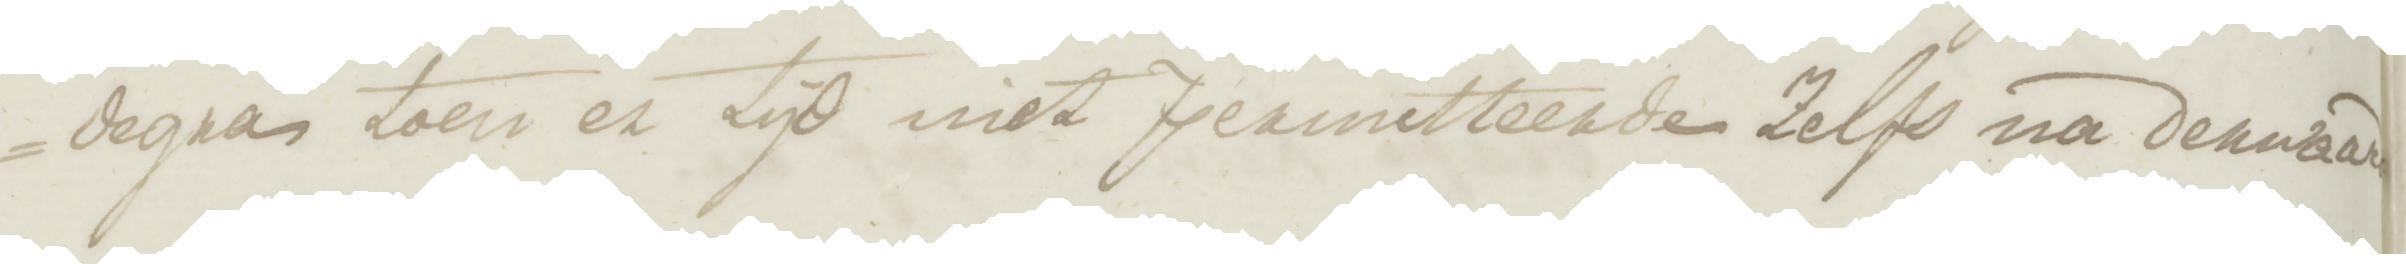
=degran toen er tijd niet permitteerde zelf na dernaar
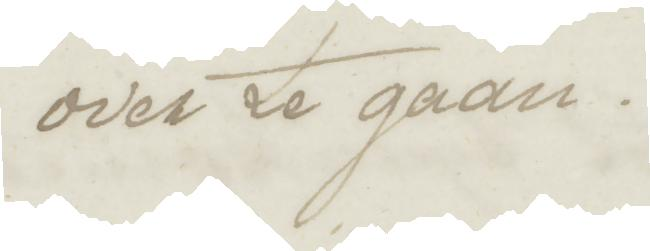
over te gaan.
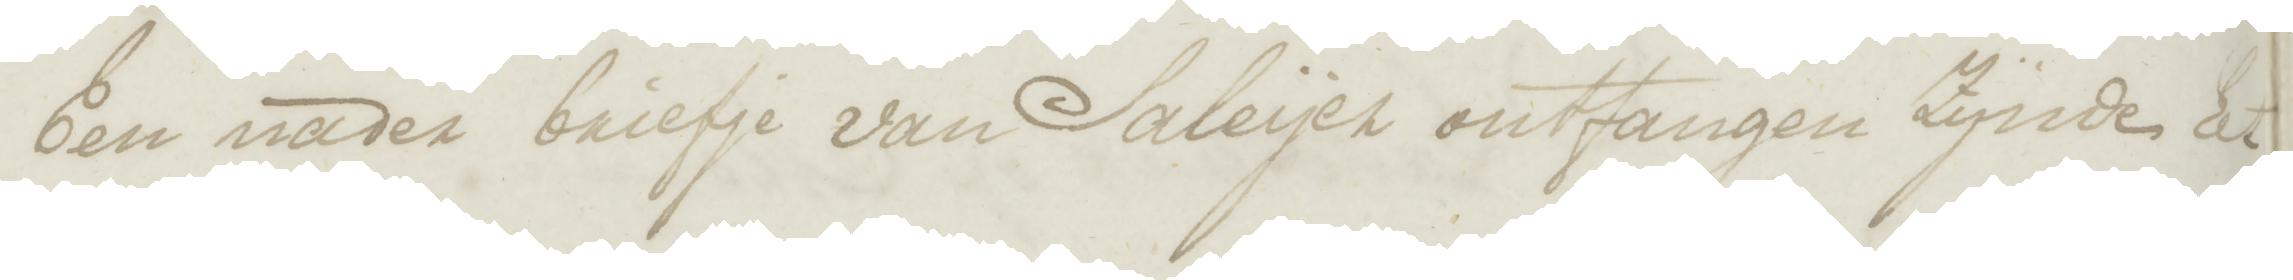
Een nader briefje van Saleijer ontfangen zijnde het
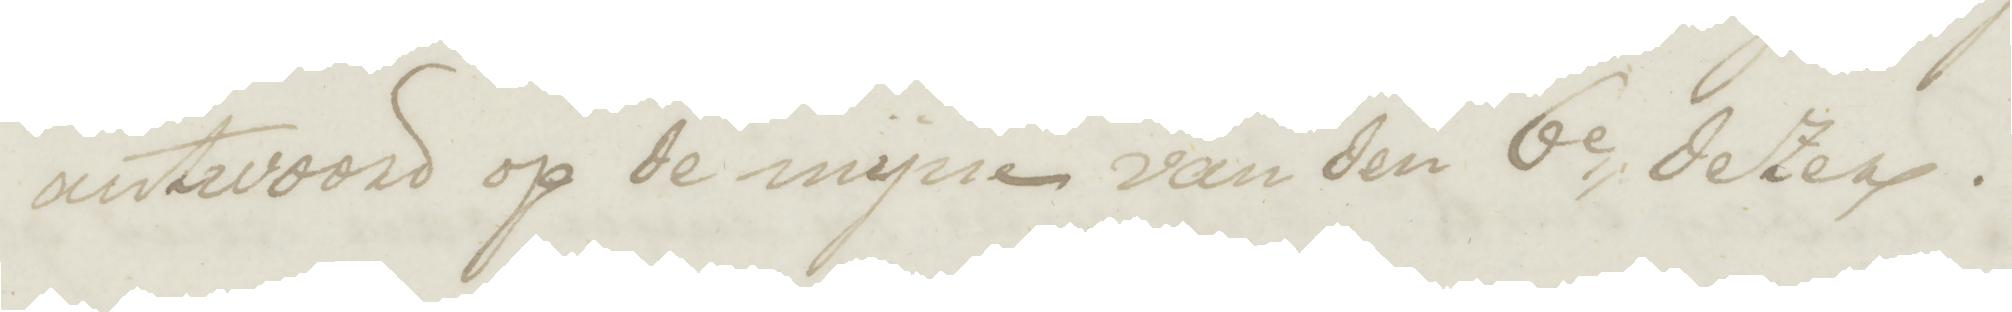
antwoord op de mijne van den 6„e dezer.
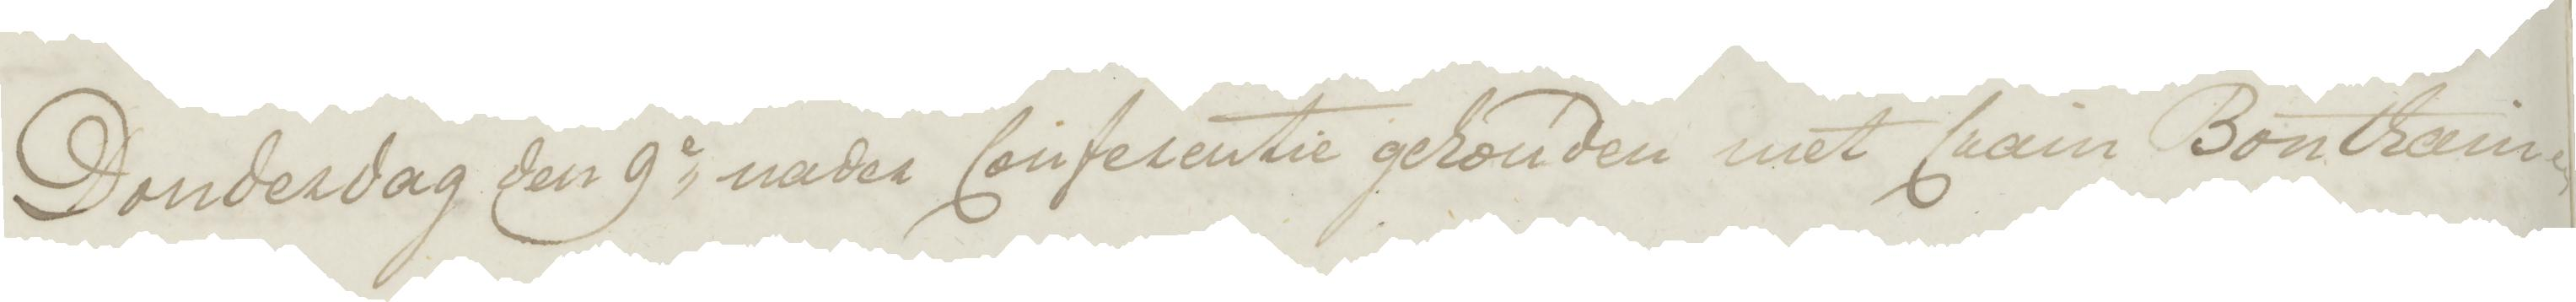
Donderdag den 9„e nader Conferentie gehouden met Crain Bonthain en
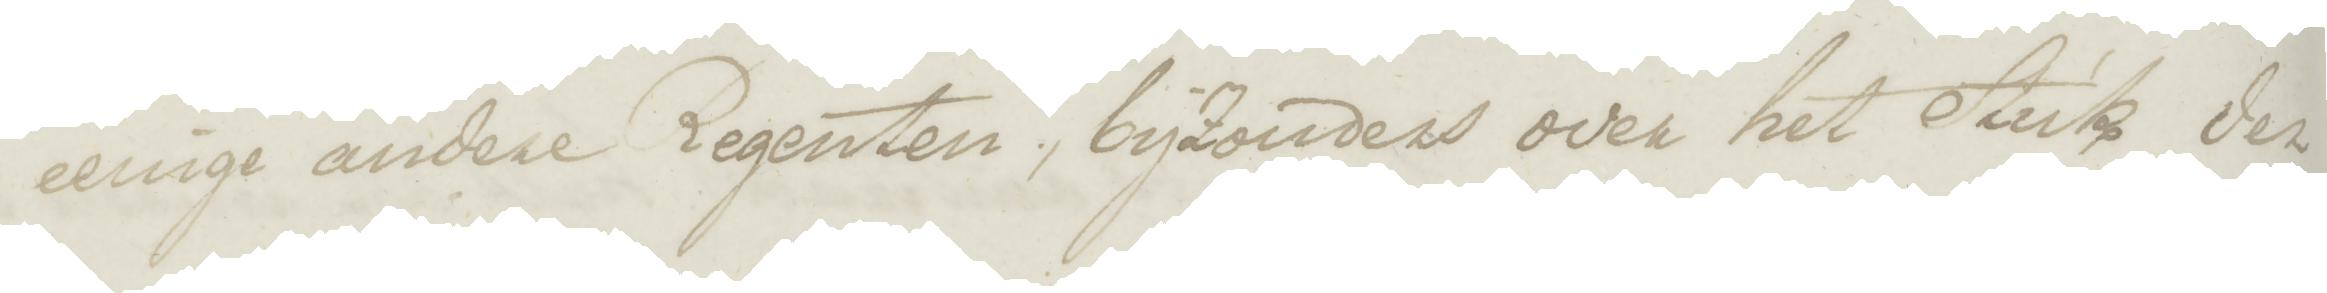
eenige andere Regenten, bijzonders over het stuk der
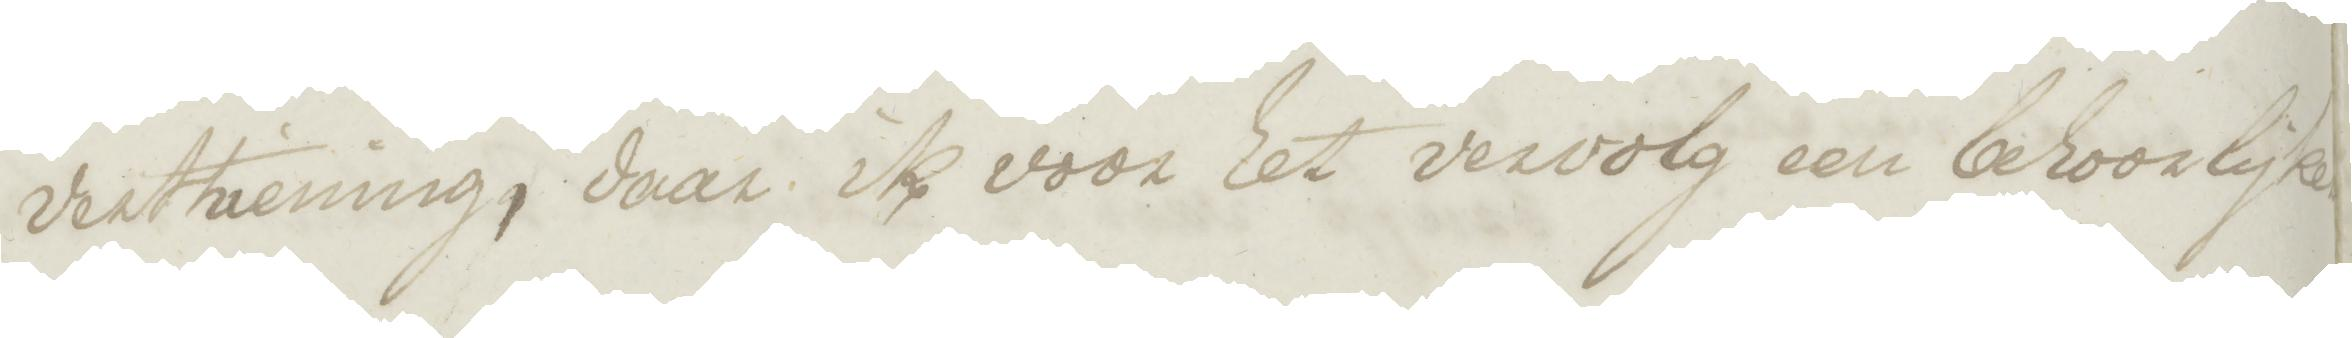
verthiening, daar ik voor het vervolg een behoorlijke
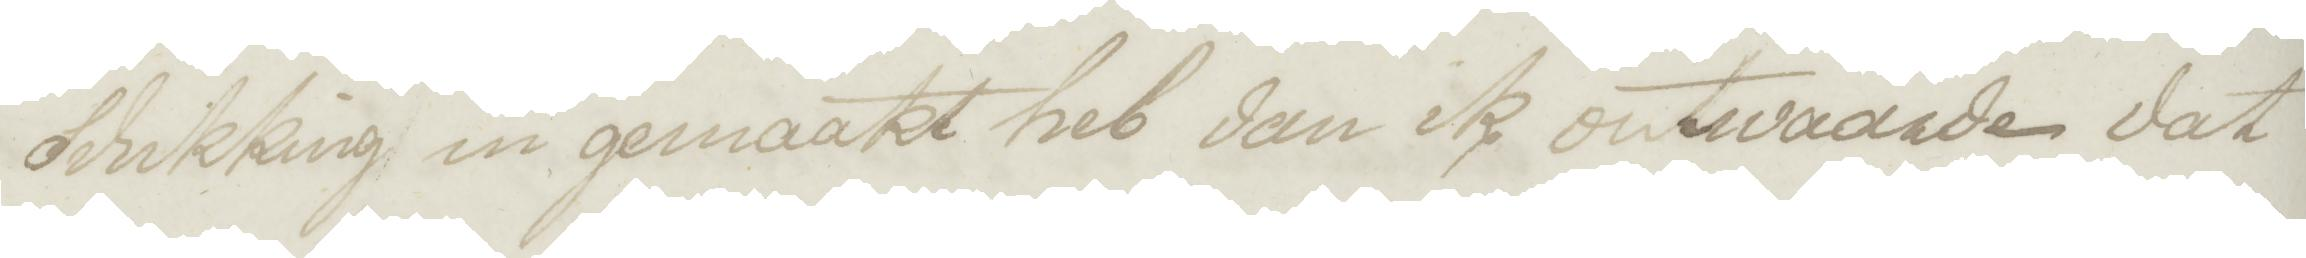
schikking in gemaakt heb dan ik ontwaarde dat
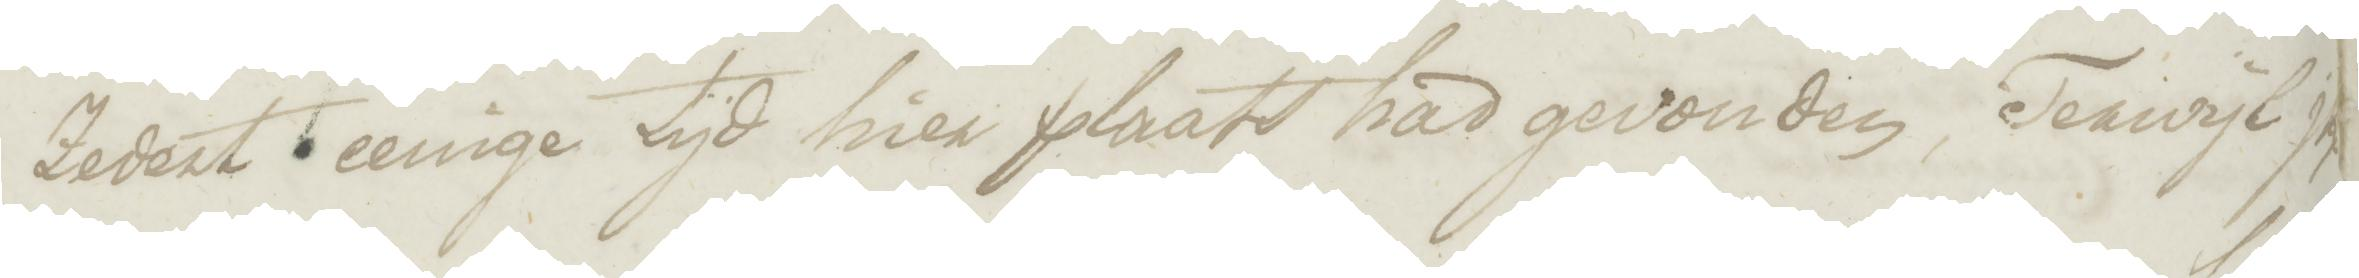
zedert eenige tijd hier plaats had gevonden, Terwijl jk
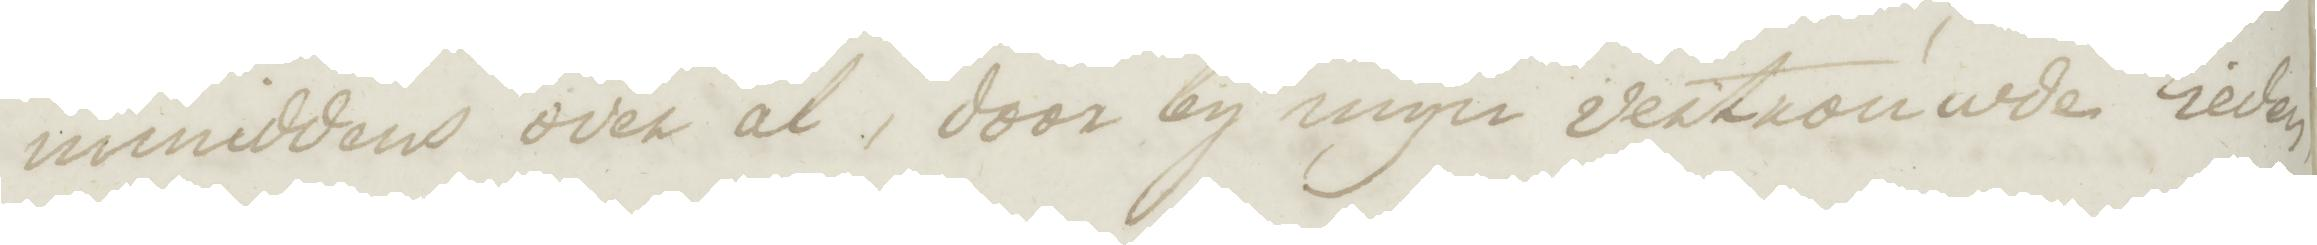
inmiddens over al, door bij mijn vertrouwde lieden
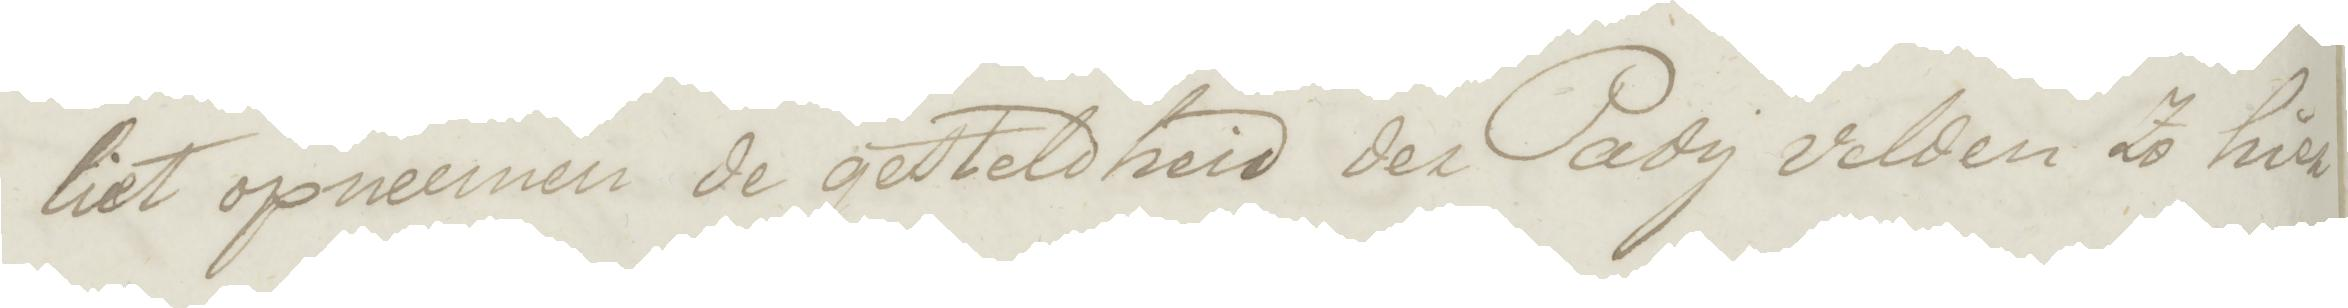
liet opneemen de gesteldheid der Padij velden zo hier
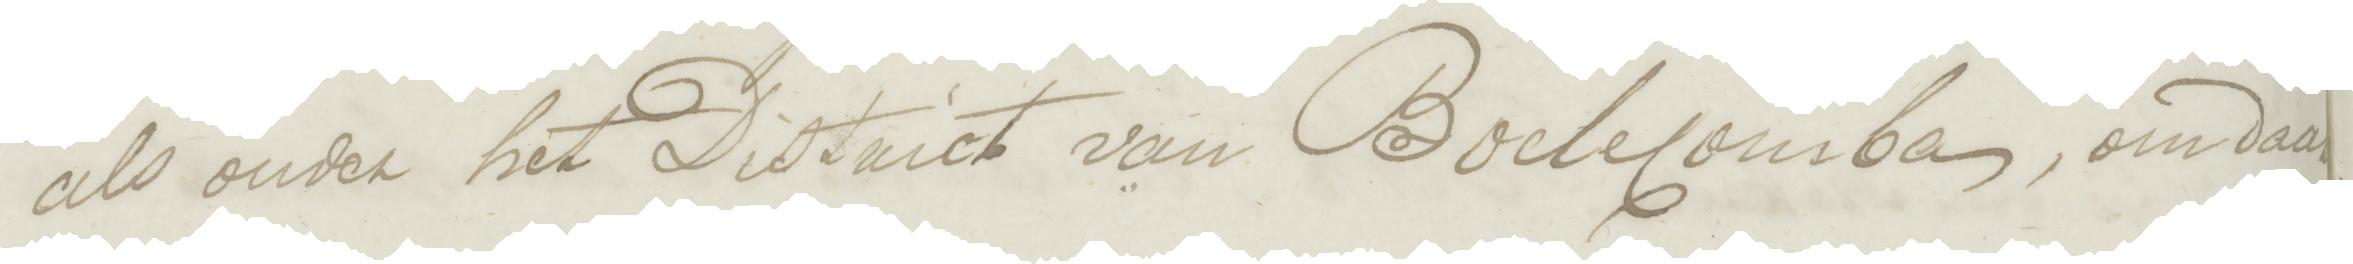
als onder het District van Boelecomba, om daa
